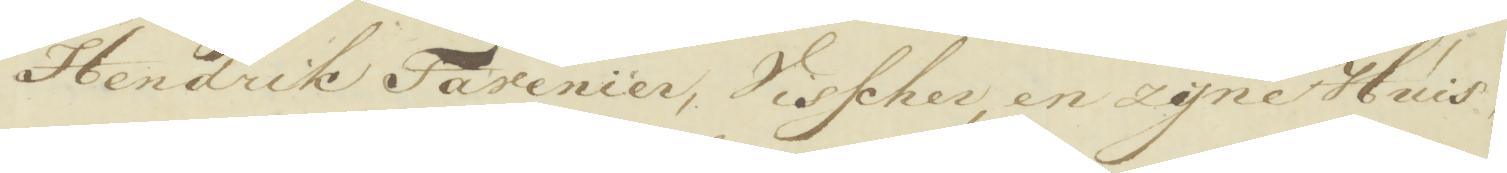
Hendrik Tavenier, Visscher, en zijne Huis
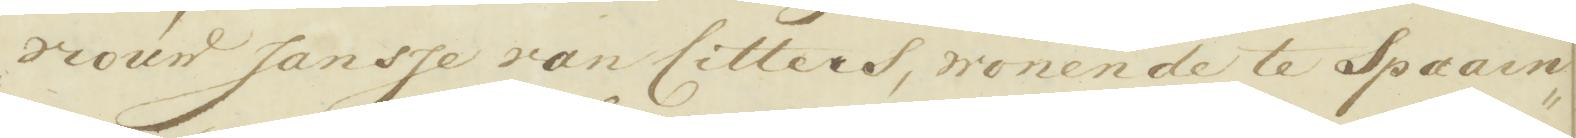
vrouw Jansje van Citters, wonende te Spaarn„
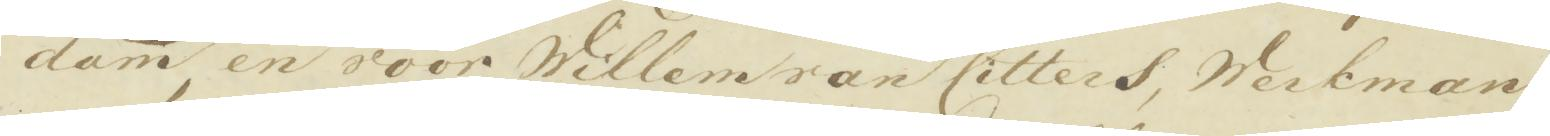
dam, en voor Willem van Citters, Werkman
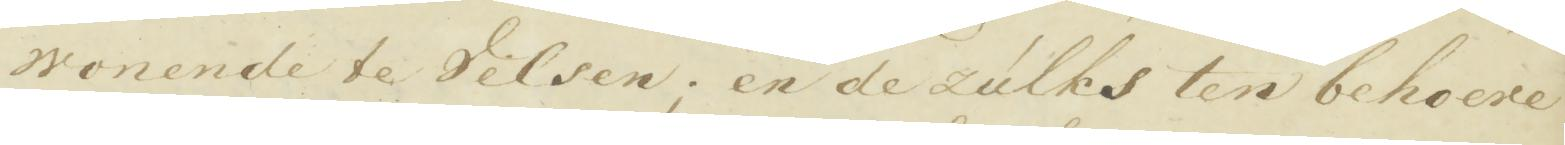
wonende te Velsen, en de zulks ten behoeve
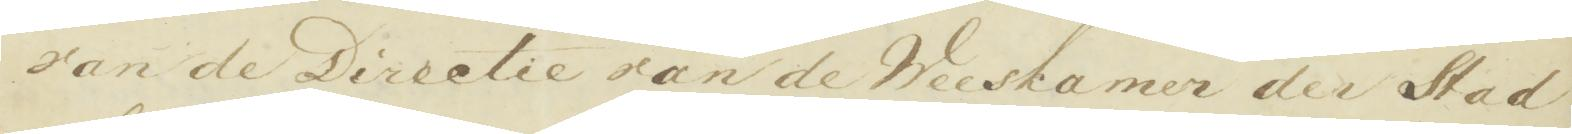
van de Directie van de Weeskamer der Stad
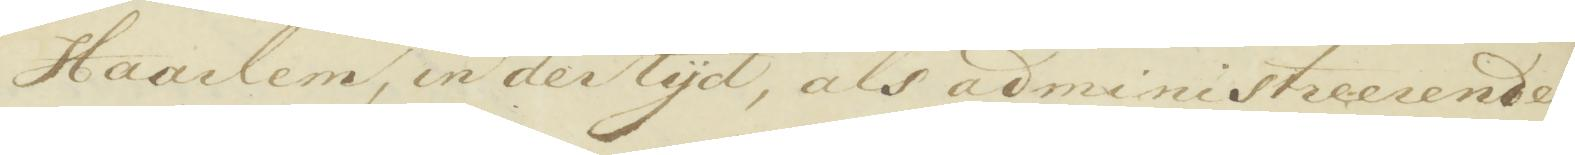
Haarlem, in der tijd, als administreerende
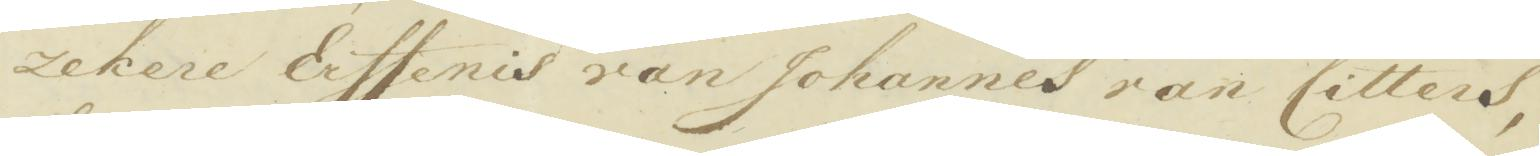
zekere Erffenis van Johannes van Citters,
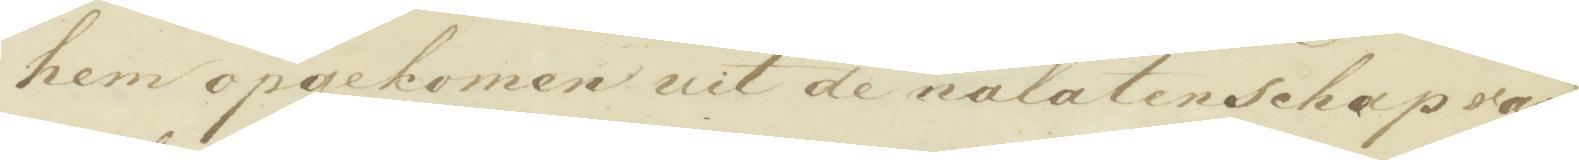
hem opgekomen uit de nalatenschap van
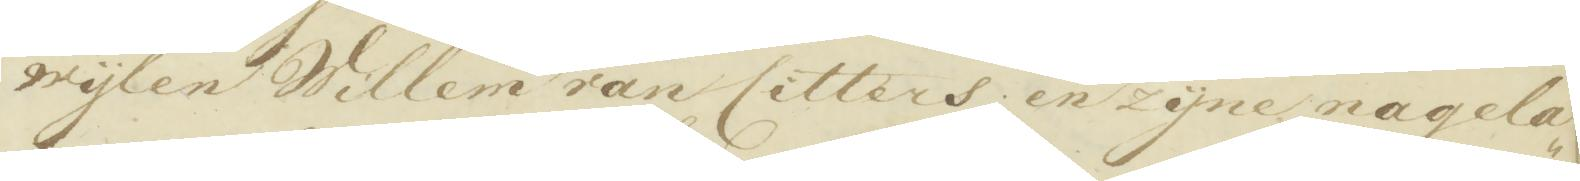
wijlen Willem van Citters, en zijne nagela„
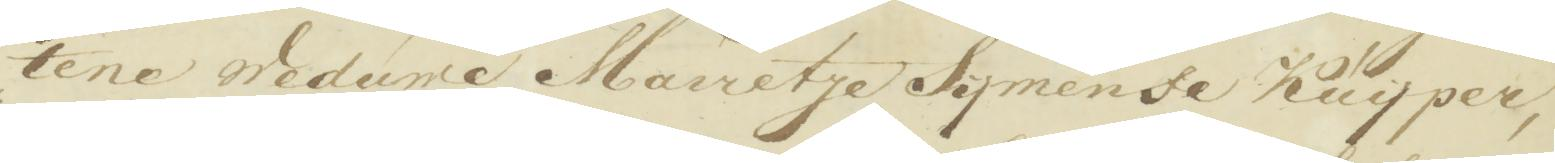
tene weduwe Marretje Sijmense Kuijper,
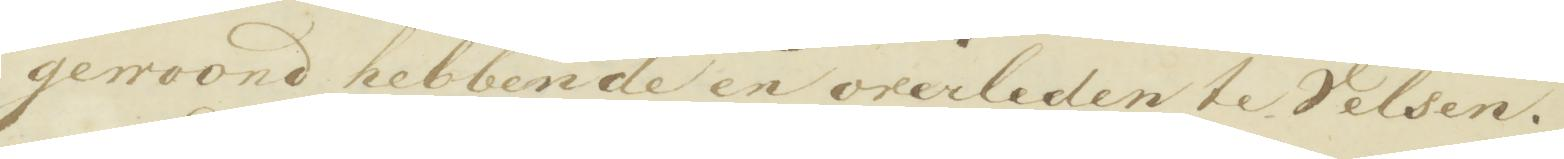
gewoond hebbende en overleden te Velsen.
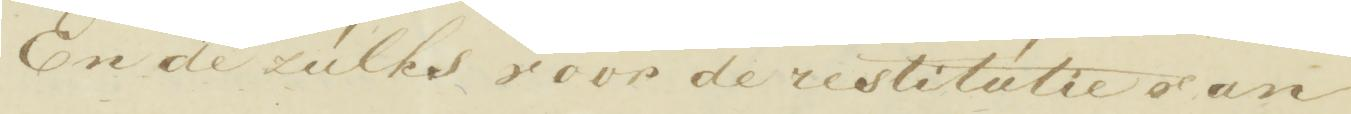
En de zulks voor de restitutie van
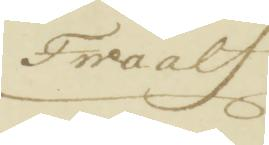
Twaalf
